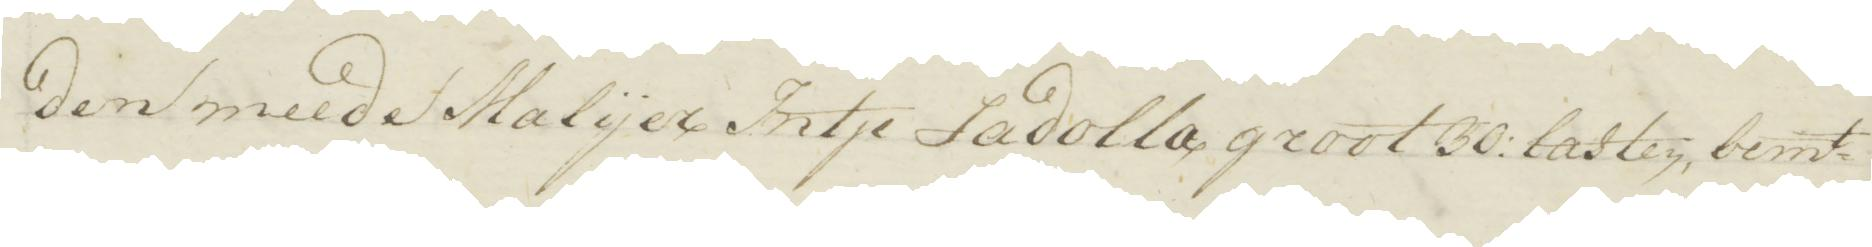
den meede Malijer Intje sadolla groot 30: lasten, bem=t
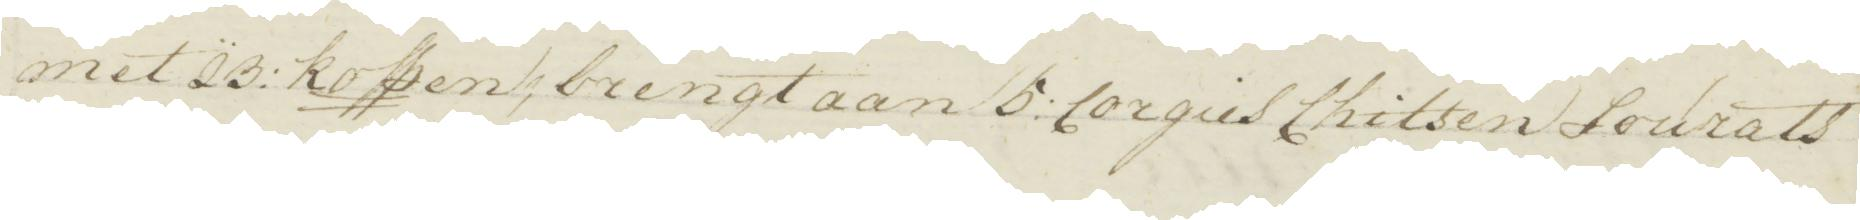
met 23: koppen; brengt aan 5: Corgies Chitsen sourats
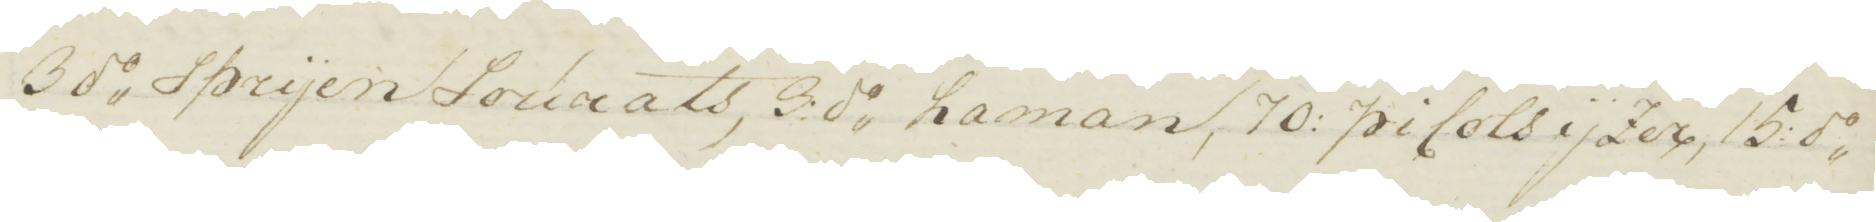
3 d„o sprijen sourats, 3: d„o haman, 70: picols ijzer, 15: d„o
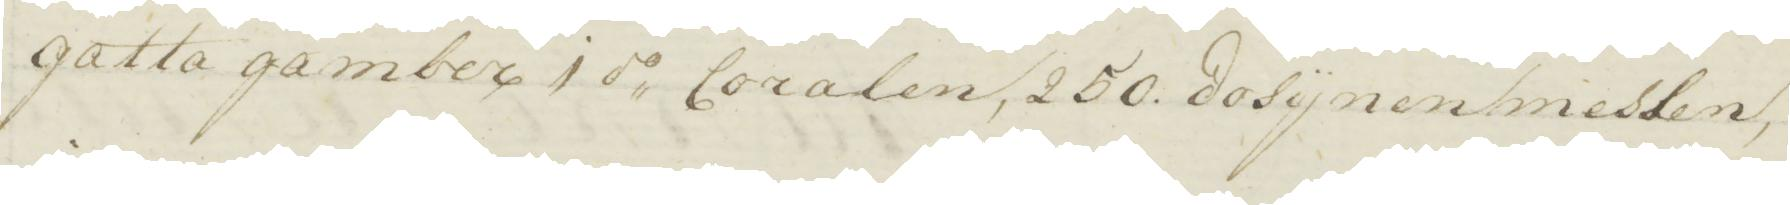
gatta gamber 1 d„o Coralen, 250. dosijnen messen,
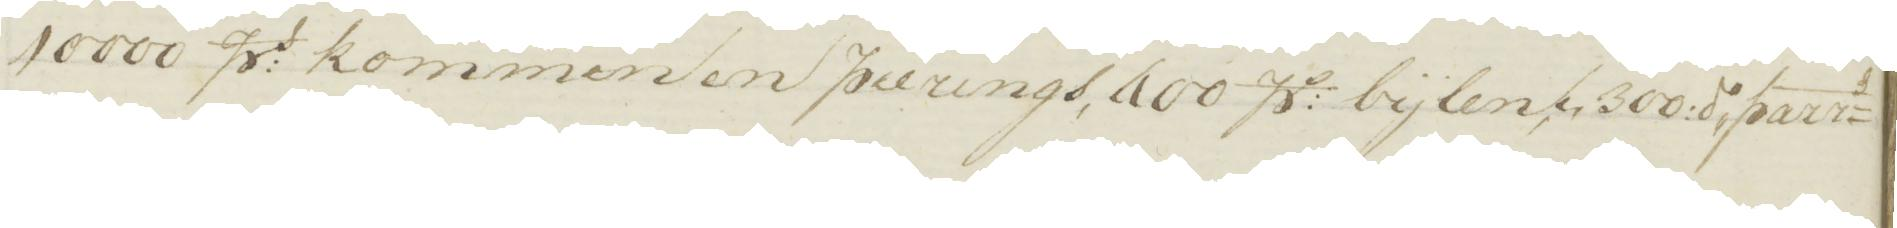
10000 p:s kommen en pierings, 400 p:s bijlen, en 300: d„o parr=s
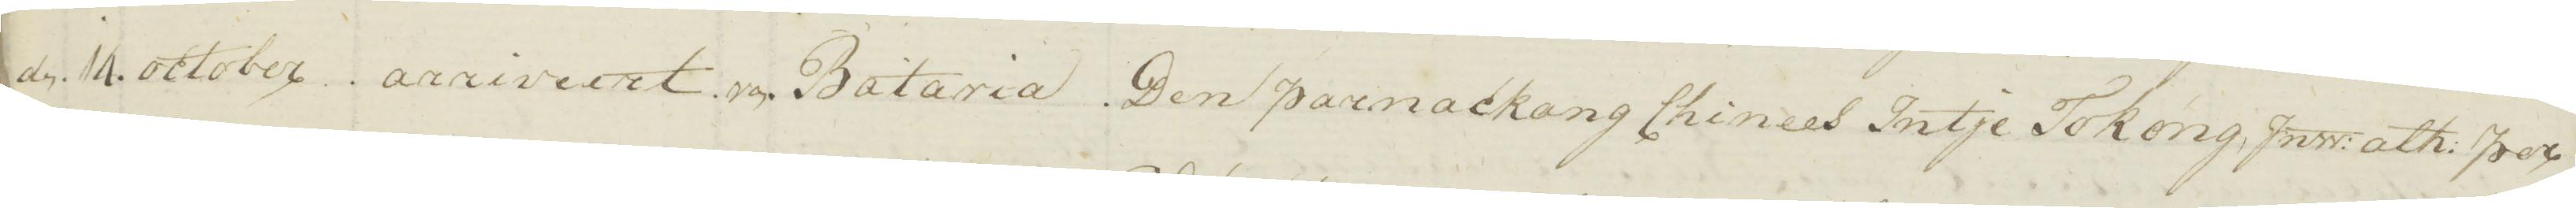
den. 14. october . . arriveert .van. Batavia . Den parnackang Chinees Intje Tokong, jnw: alh: per
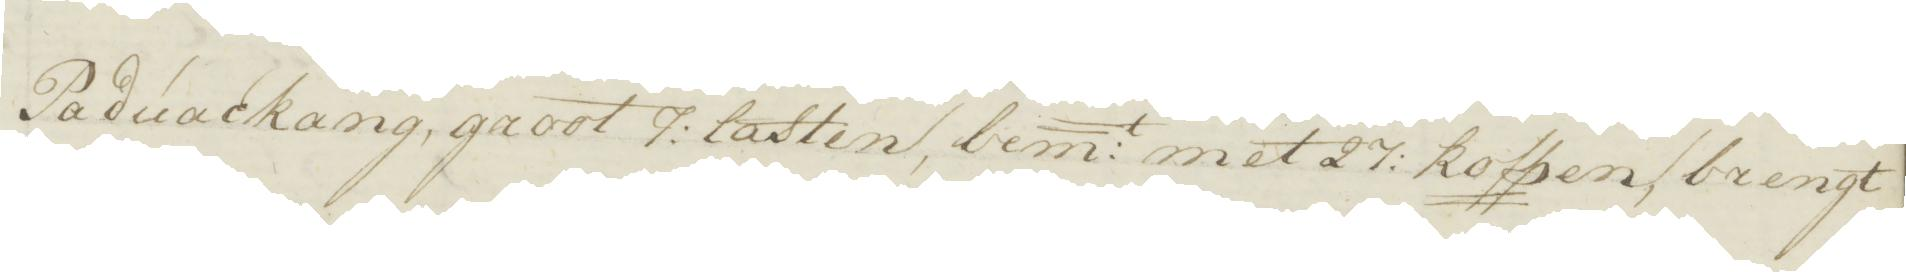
Paduackang, groot 7: lasten, bem:t met 27: koppen, brengt
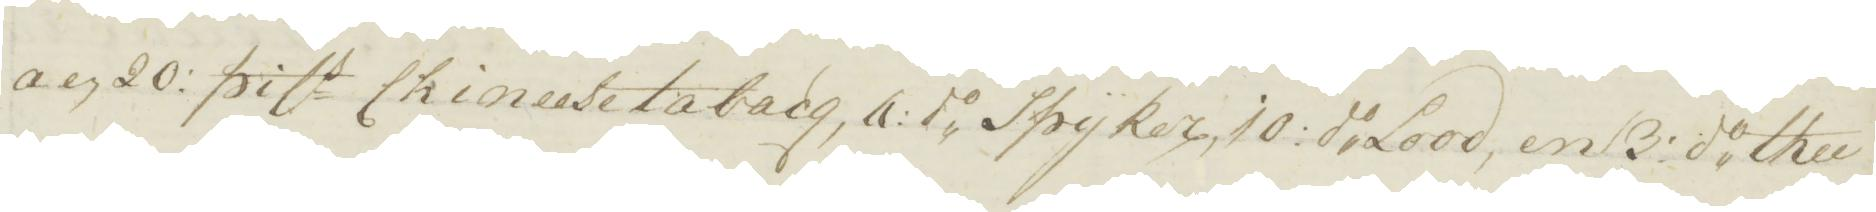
aen 20: pic=s Chineese tabacq, 4: d„o spijker, 10: d„o Lood, en 3: d„o thee
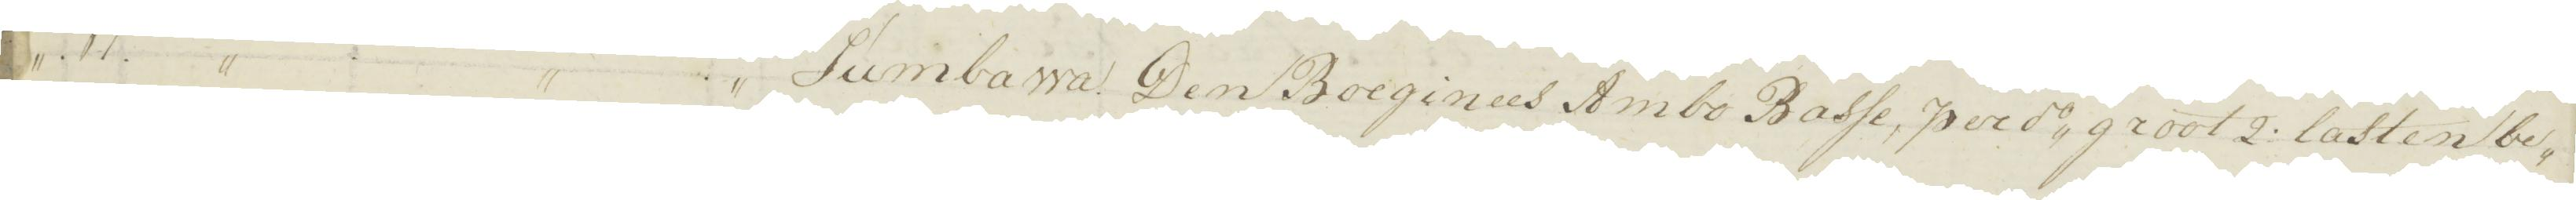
„ .17. „ . „ . „ Sumbawa. Den Boeginees Ambo Basse, per d„o groot 2: lasten be„
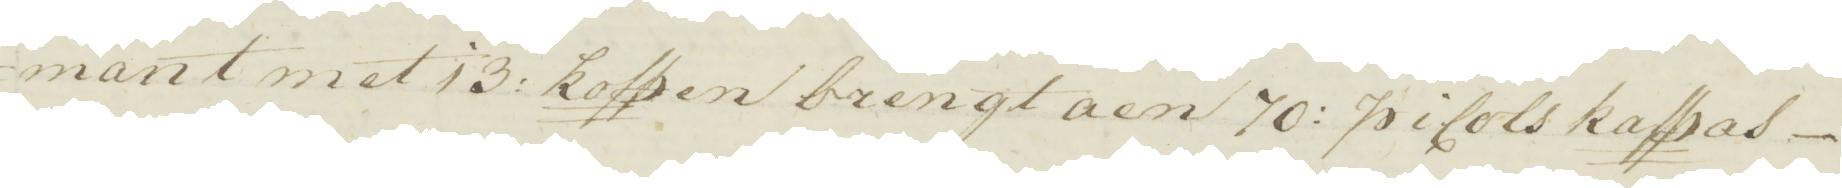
mant met 13: koppen brengt aen 70: picols kappas —
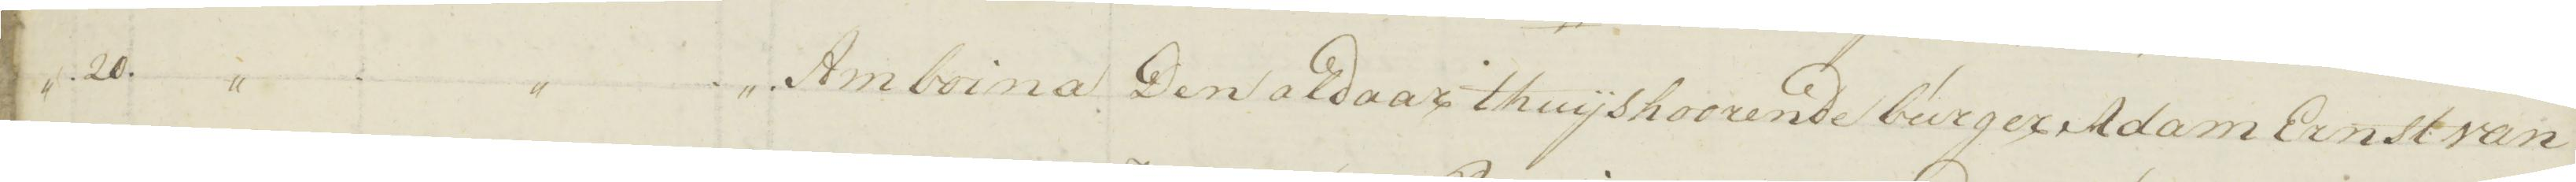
„ .20. „ . „ . „. Amboina Den aldaar thuijshoorende burger Adam Ernst van
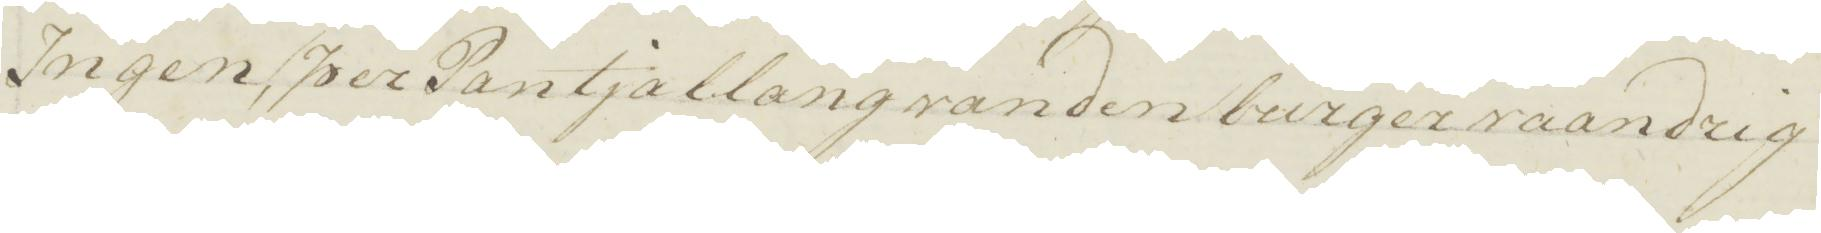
Ingen, per Pantjallang van den burger vaandrig
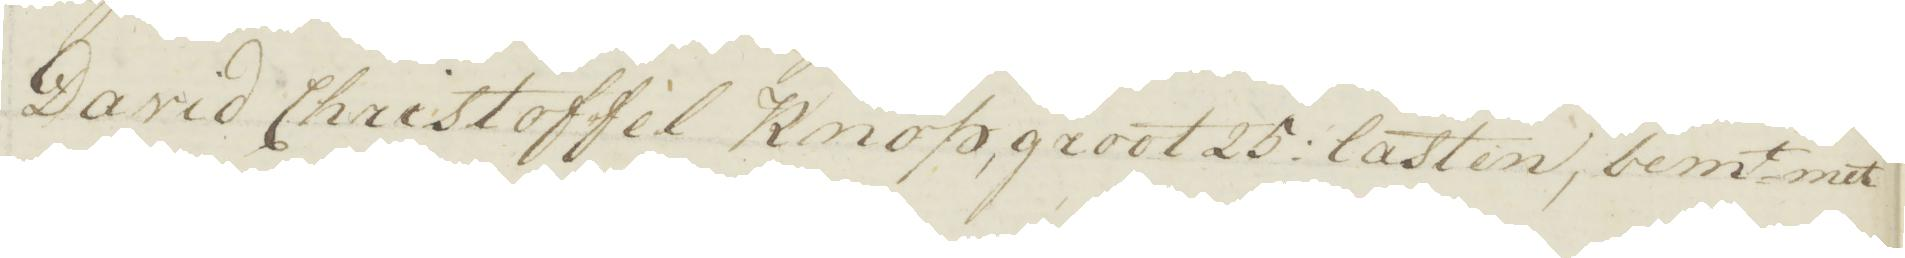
David Christoffel Knop, groot 25: lasten, bem:t met
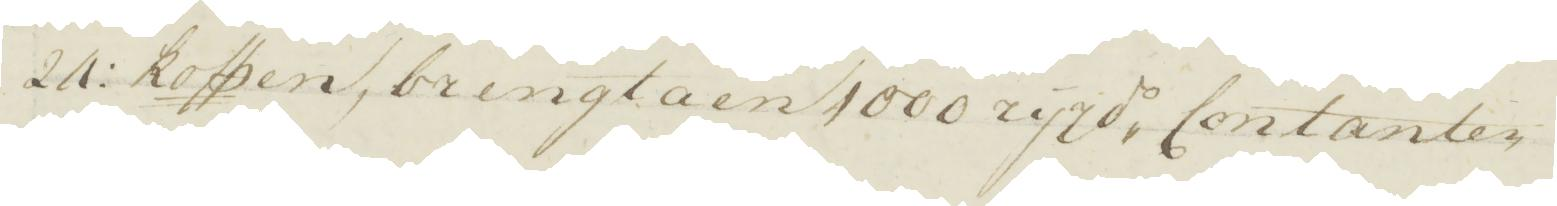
24: koppen, brengt aen 1000 rijxd„s Contanten
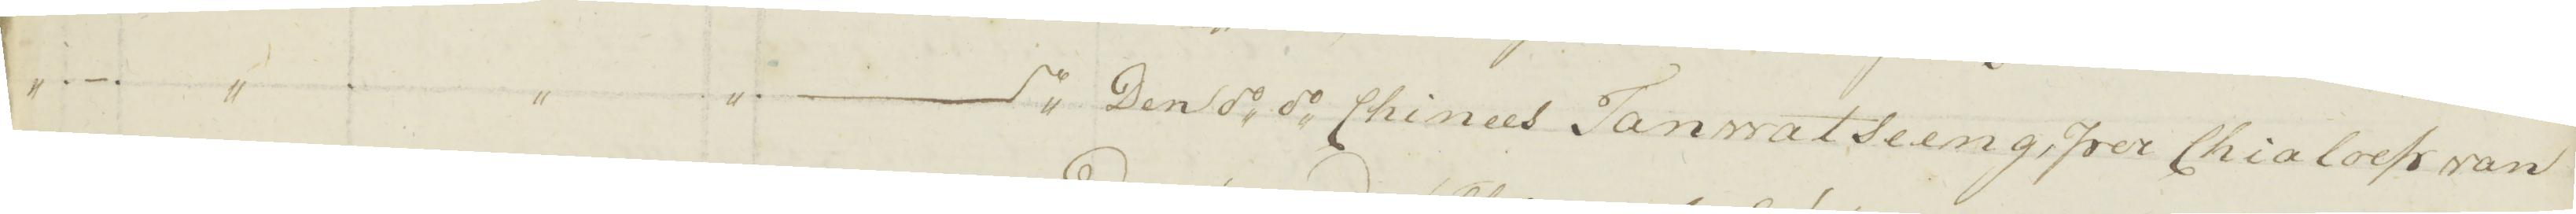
„ .—. „ . „ . „ . _„o Den d„o d„o Chinees Tanwatseeng, per Chialoep van
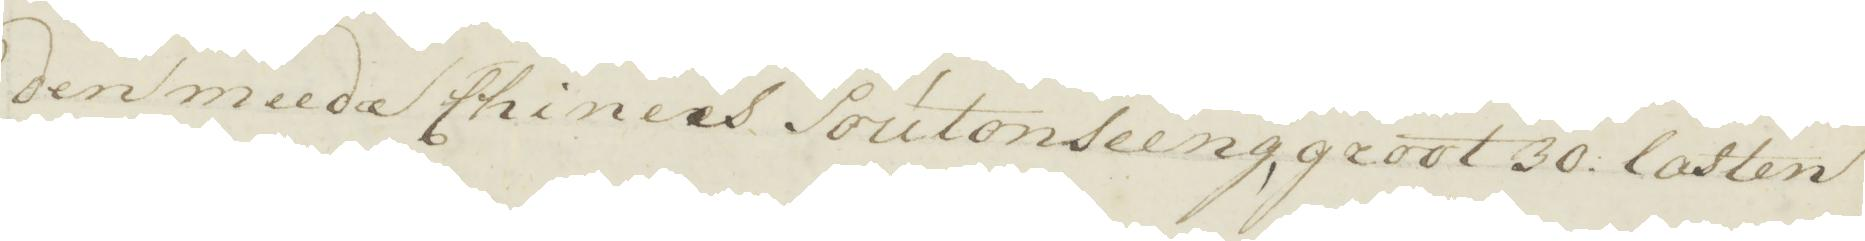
den meede Chinees soutonseeng, groot 30. lasten
